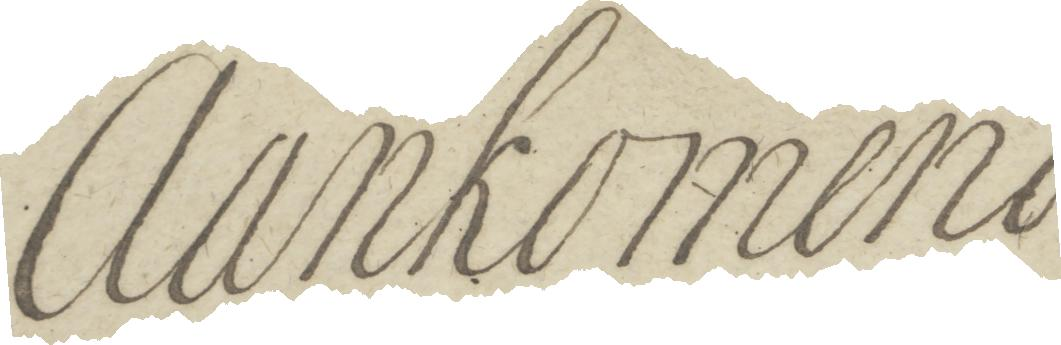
Aankomend
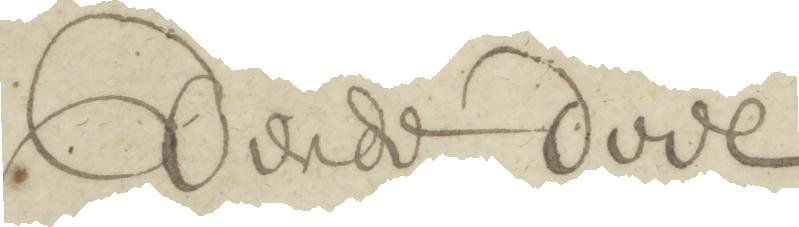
derde deel
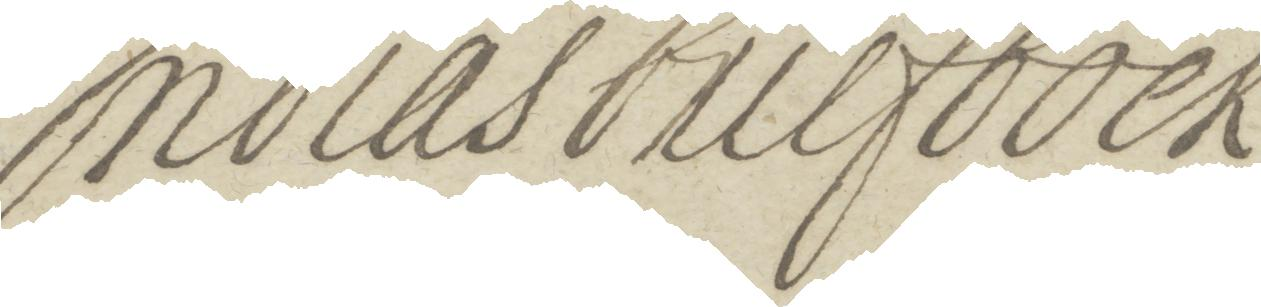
Indias briefboek
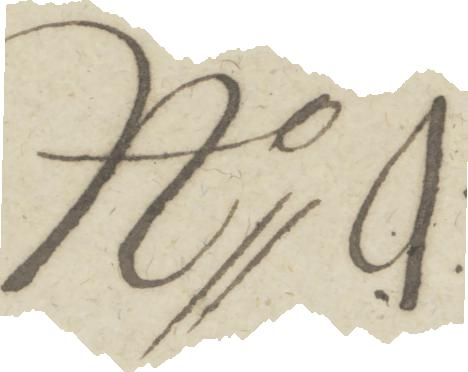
N„o 4
